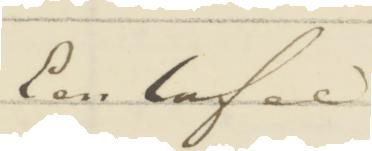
Een tafel
